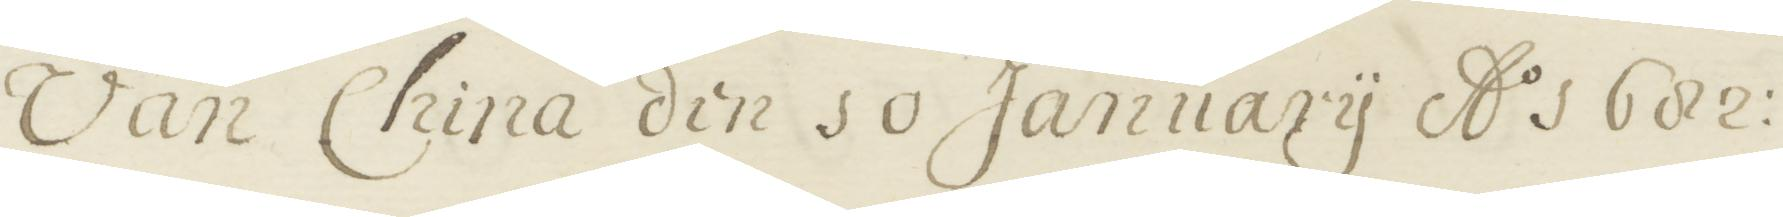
Van China den 10 Januarij Ao 1682:
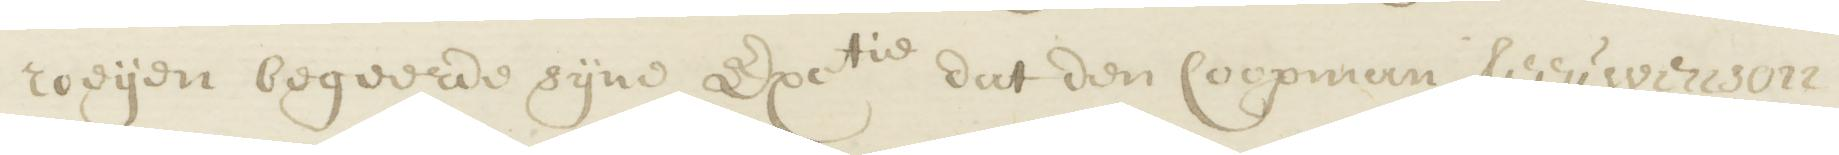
roeijen begeerde sijne Exctie dat den Coopman Leeuwenson
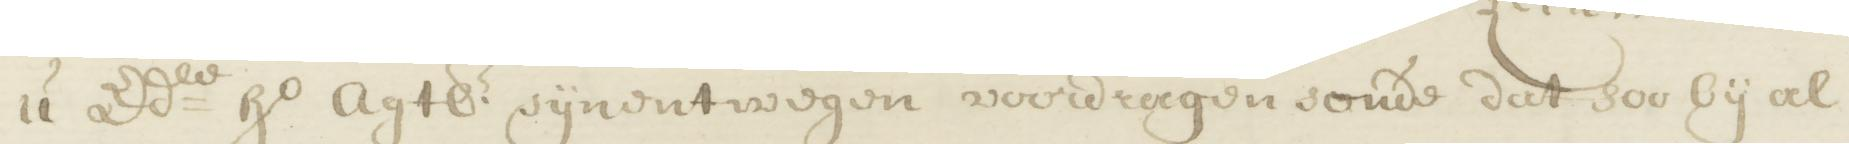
u Ed=le ho Agtb. sijnentwegen voordragen soude dat soo bij al
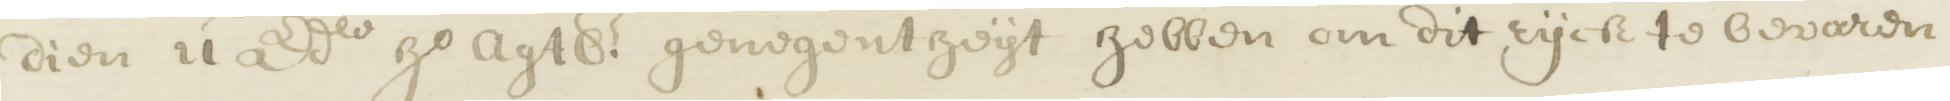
dien u Edle ho Agtb. genegentheijt hebben om dit rijck te bevaren
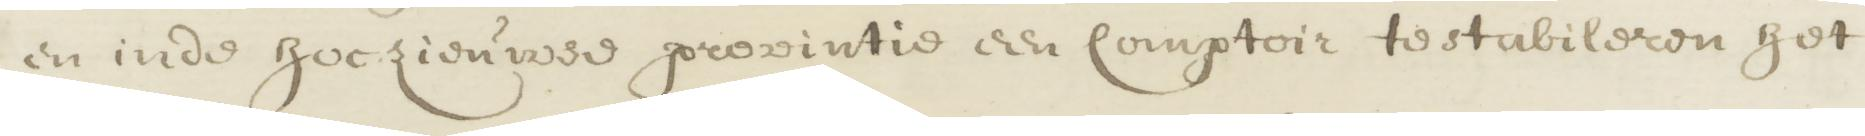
en inde hoczieuwse provintie een Comptoir te stabileren het
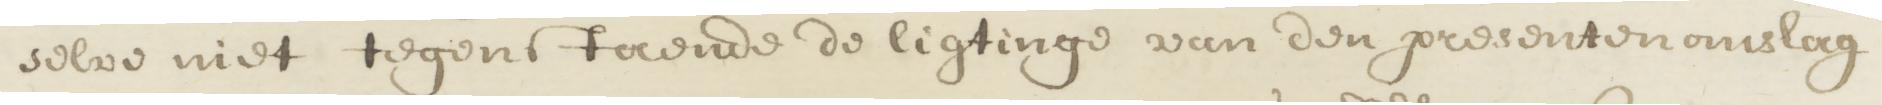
selve niet tegenstaende de ligtinge van den presenten omslag
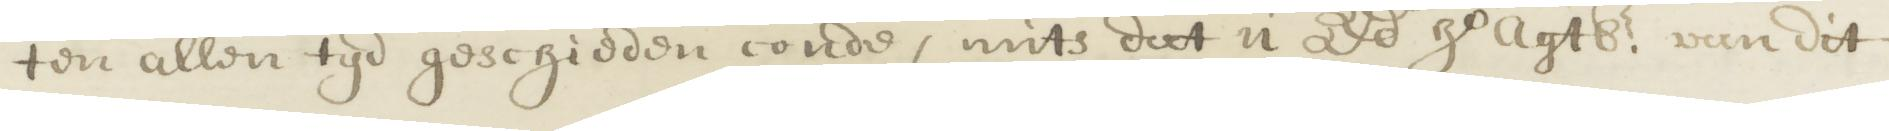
ten allen tijd geschieden conde, mits dat u Edle Agtb. van dit
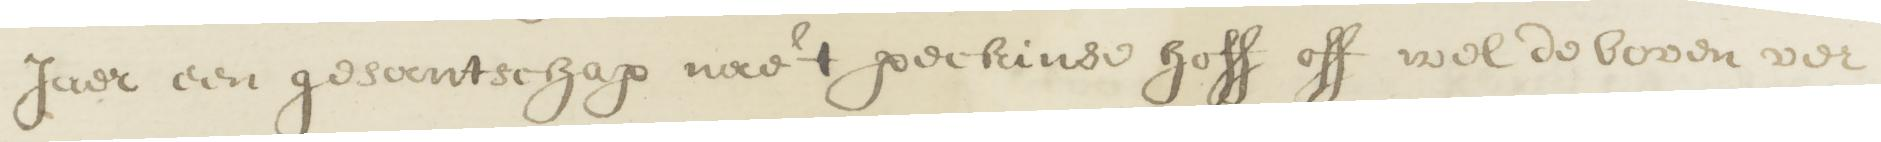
Jaer een gesantschap nae't peckinse hoff off wel de boven ver
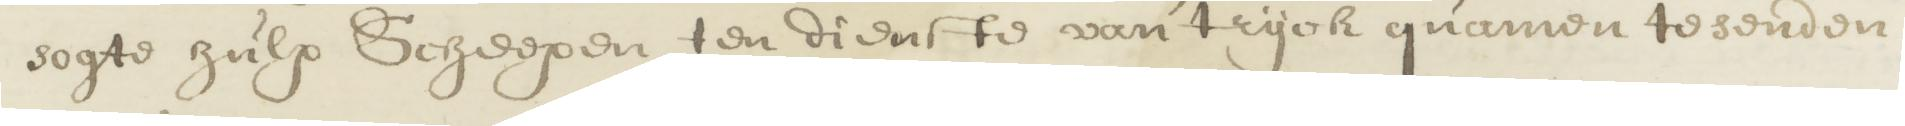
sogte hulp Scheepen ten dienste van ’t rijck quamen te senden
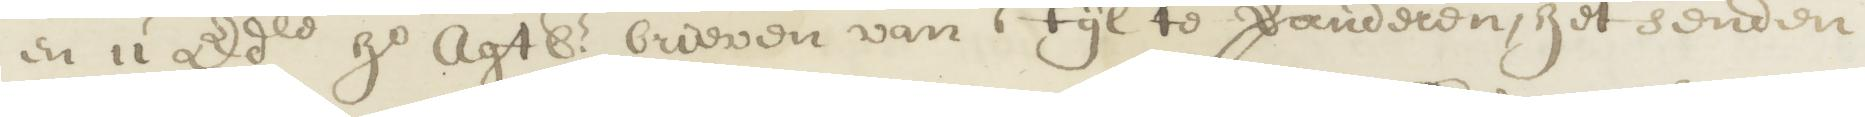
en u Edle ho Agtb. brieven van stijl te veranderen, het senden
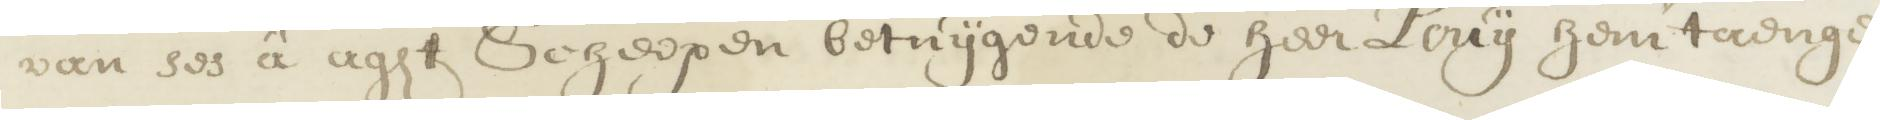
van ses â aght Scheepen betuijgende de heer Pouij hem 'taenge
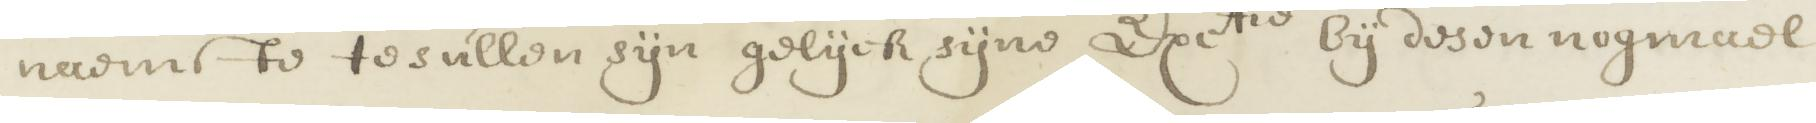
naemste te sullen sijn gelijck sijne Exctie bij desen nogmael
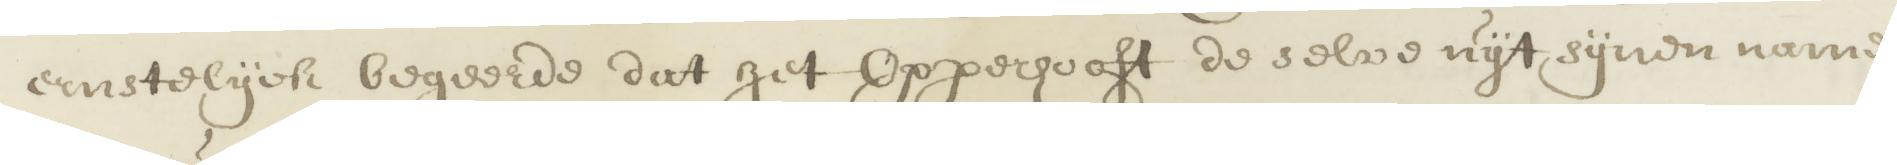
ernstelijck begeerde dat het Opperhooft de selve uijt sijnen name
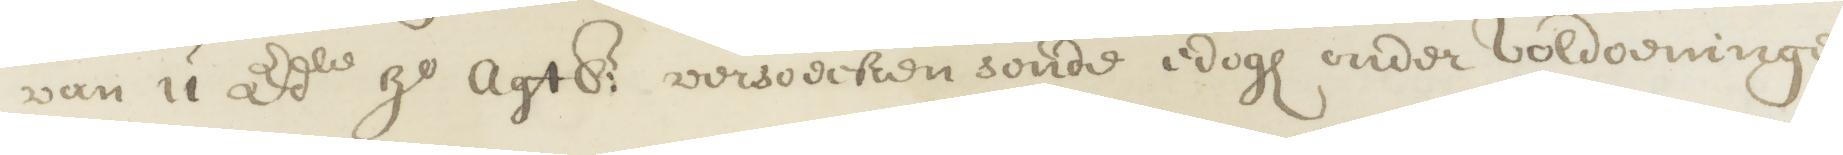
van u Edle ho Agtb: versoecken soude edogh onder voldoeninge
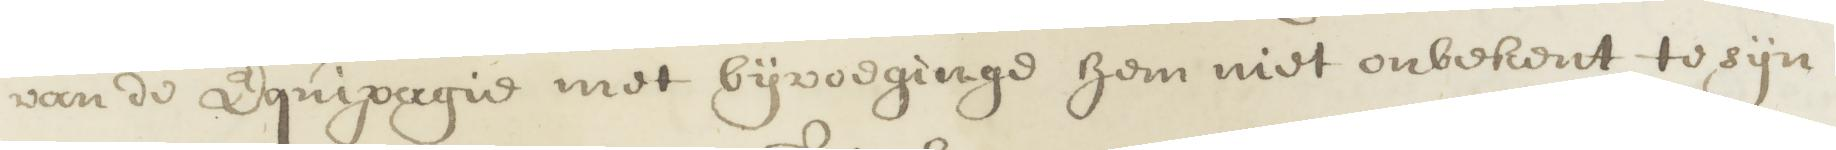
van de Equipagie met bijvoeginge hem niet onbekent te sijn
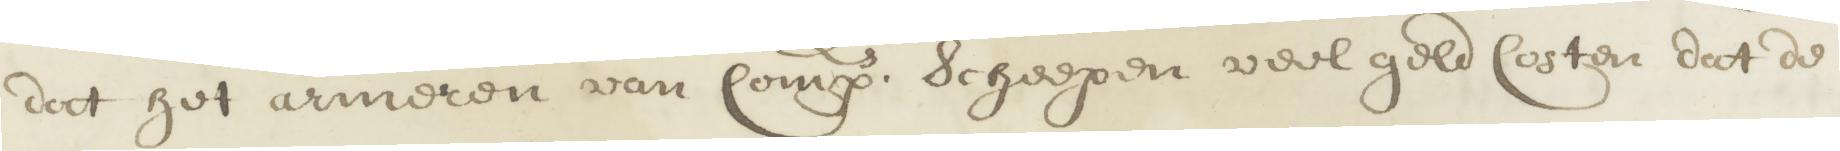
dat het armeren van Comp.s Scheepen veel geld Costen dat de
